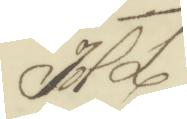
HL
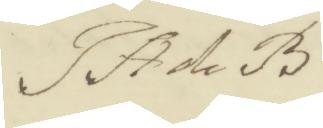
I A de B
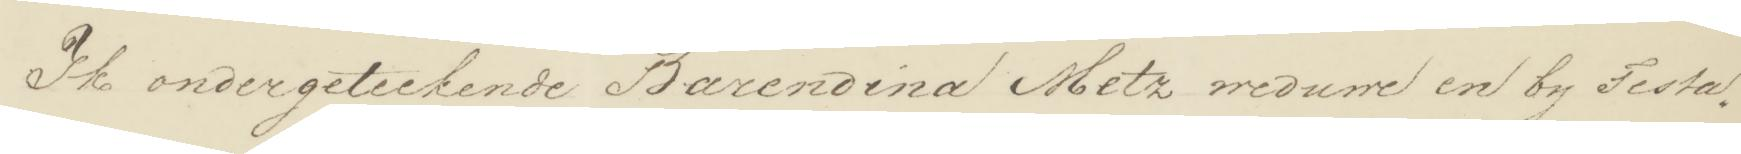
Ik ondergeteekende Barendina Metz weduwe en by Testa„
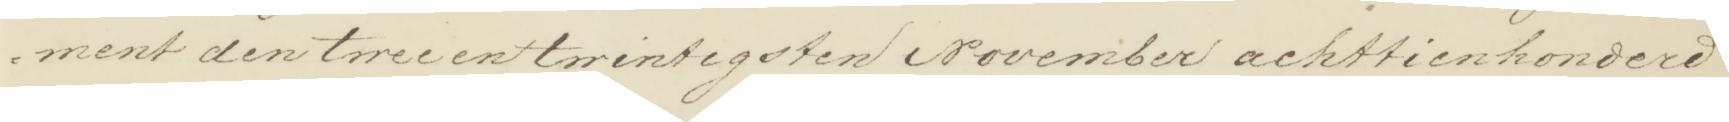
„ment den twee en twintigsten November achttienhonderd
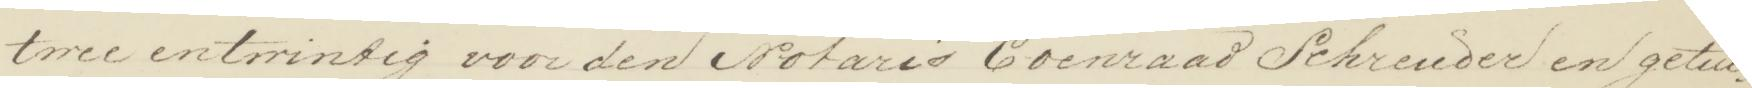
twee entwintig voor den Notaris Coenraad Schreuder en getui„
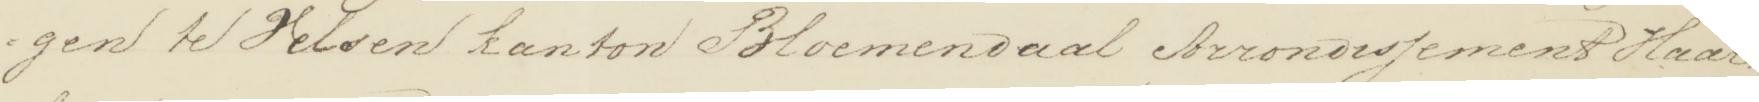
„gen te Velsen kanton Bloemendaal Arrondissement Haar
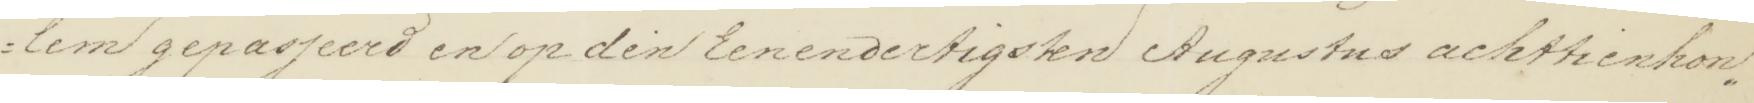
=lem gepasseerd en op den Eenendertigsten Augustus achttienhon„
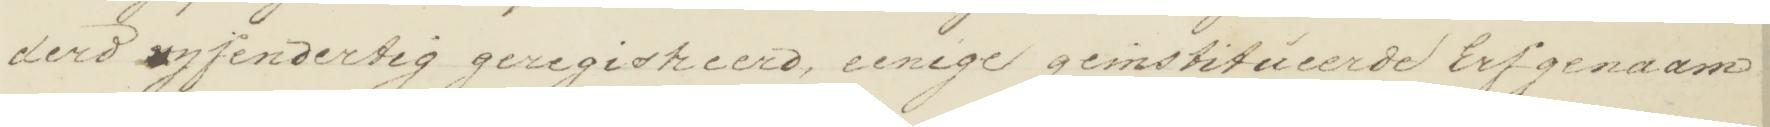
derd vyfendertig geregistreerd, eenige geinstitueerde Erfgenaam
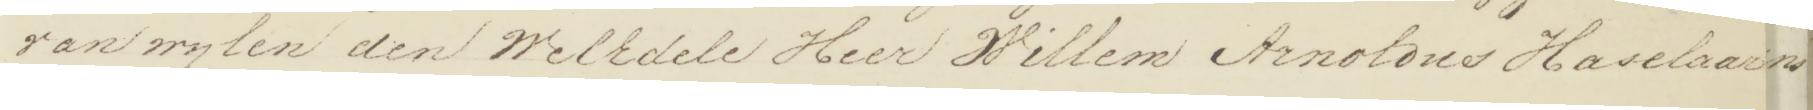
van wylen den WelEdele Heer Willem Arnoldus Haselaar
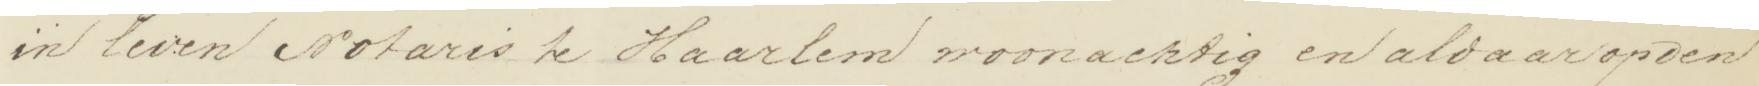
in leven Notaris te Haarlem woonachtig en aldaar op den
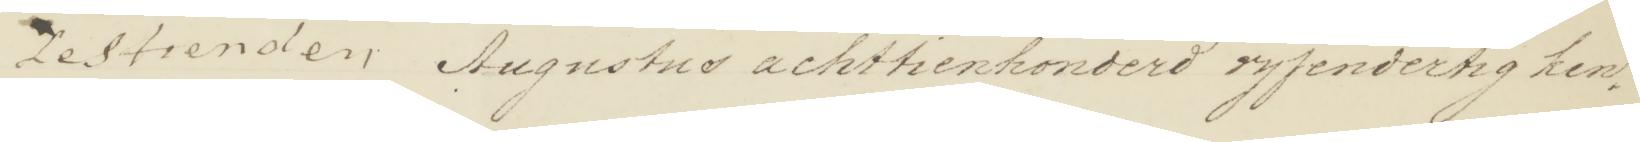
Zestienden Augustus achttienhonderd vyfendertig kin„
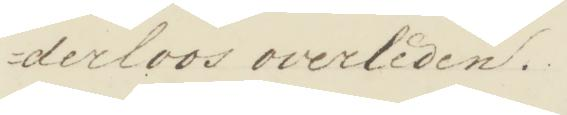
=derloos overleden.
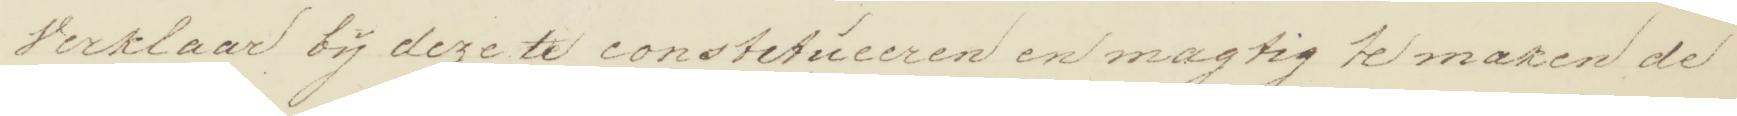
Verklaar bij deze te constitueeren en magtig te maken de
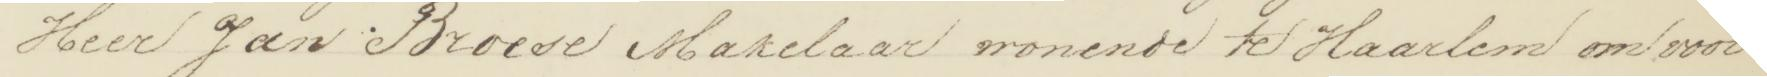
Heer Jan Broese Makelaar wonende te Haarlem om voor
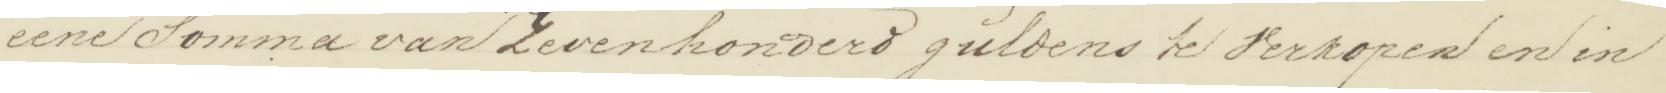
eene somma van Zevenhonderd guldens te verkopen en in
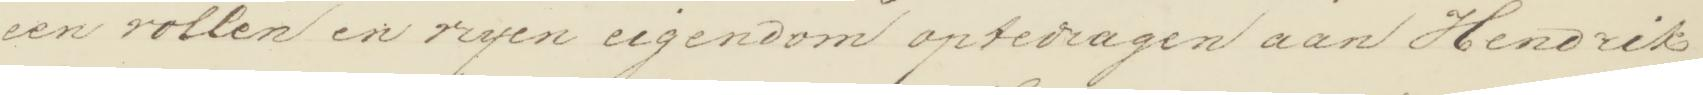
een vollen en vryen eigendom optedragen aan Hendrik
